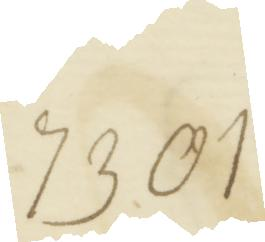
7301
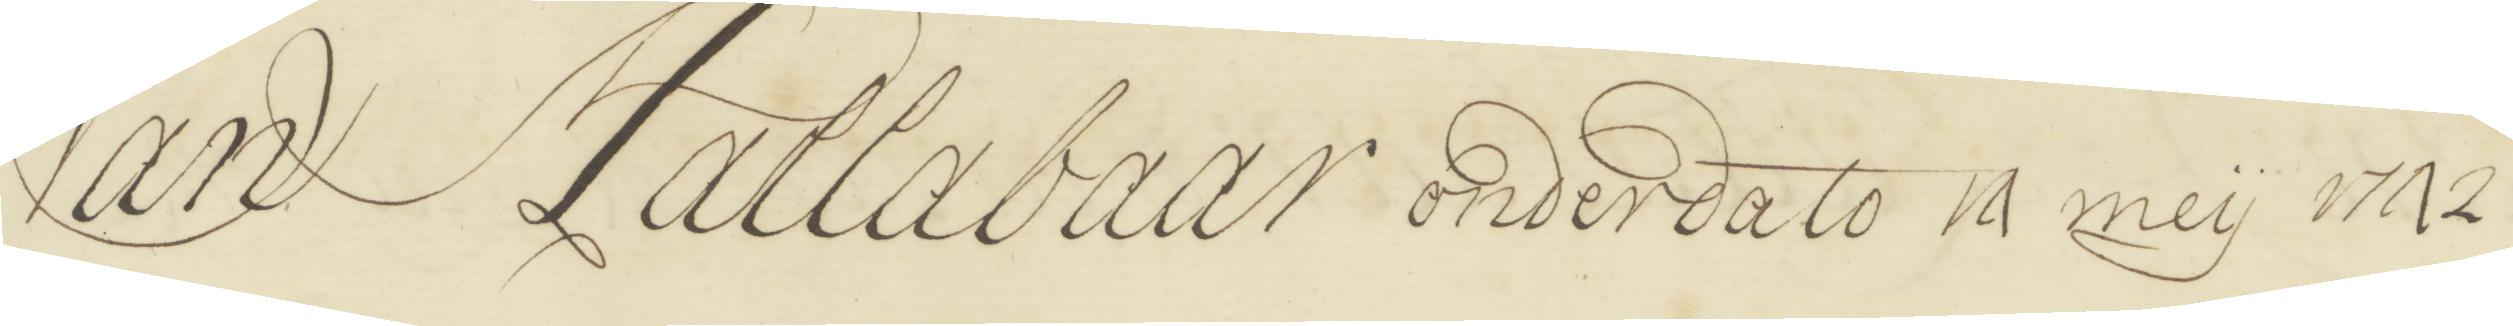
Van Mallabaar onderdato 14 meij 1742
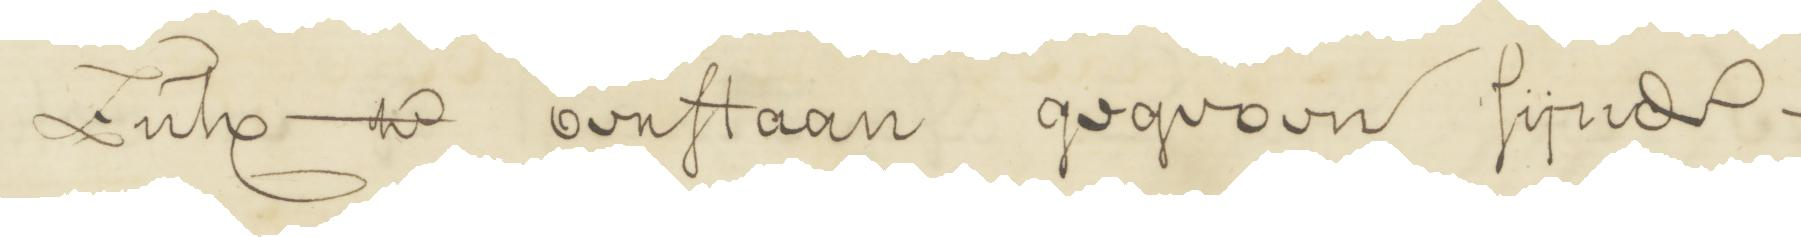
zulx te verstaan gegeven sijnde
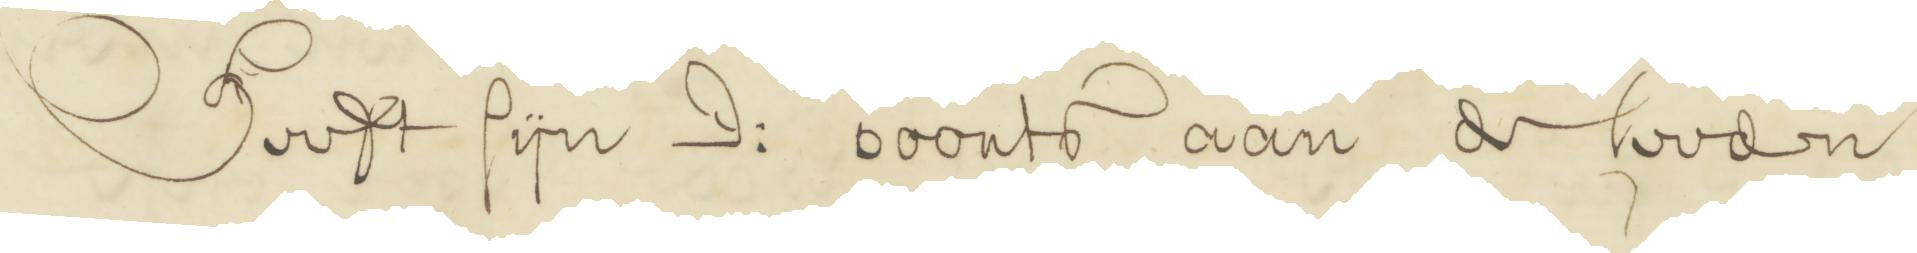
Heeft sijn E: voorts aan de leeden
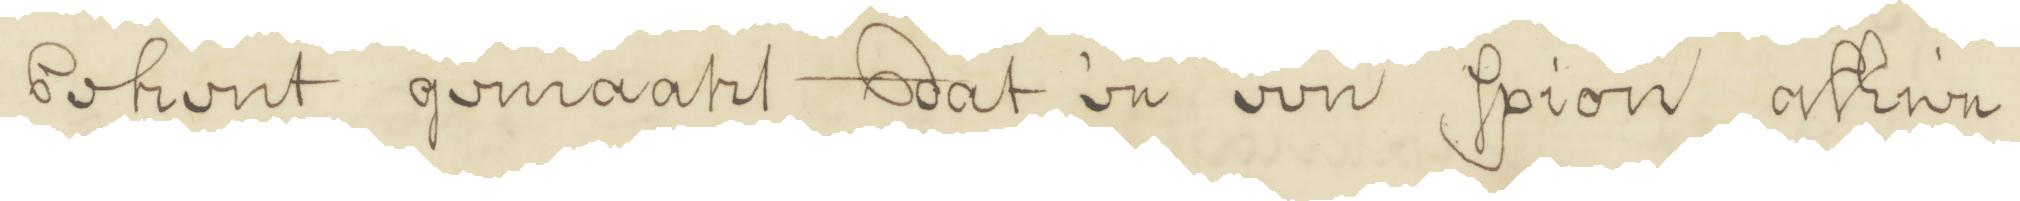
bekent gemaakt dat er een spion alhier
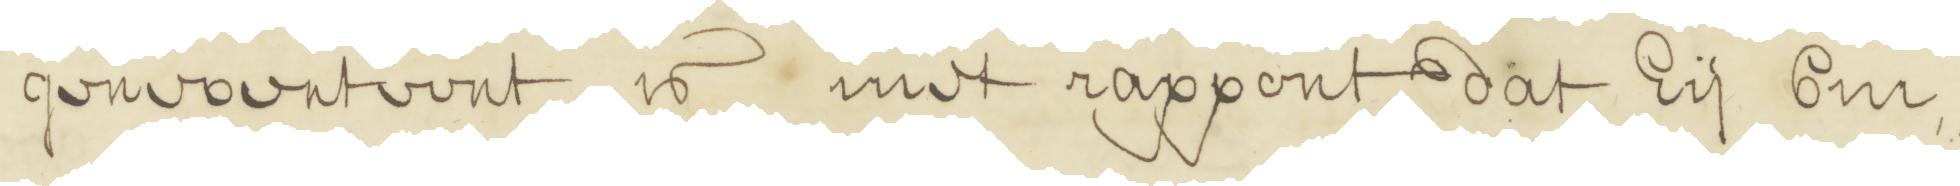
gereverteert is met rapport dat hij bin„
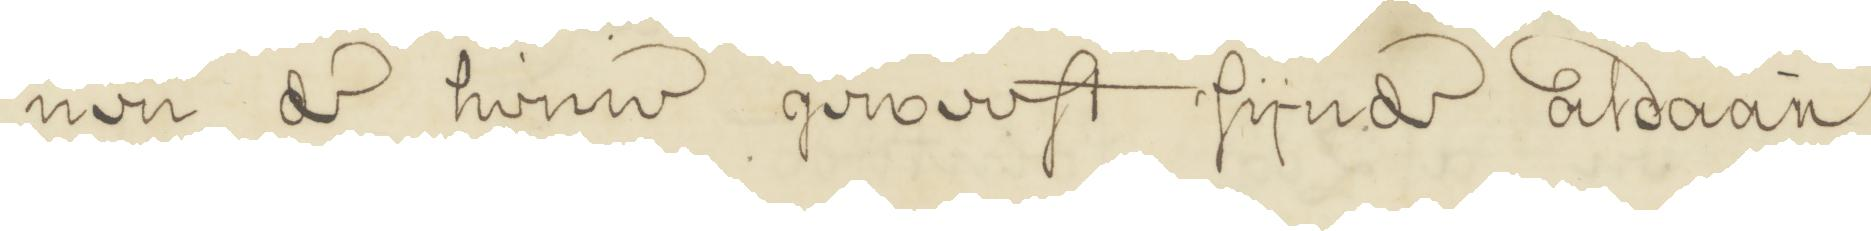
nen de lienie geweest sijnde aldaar
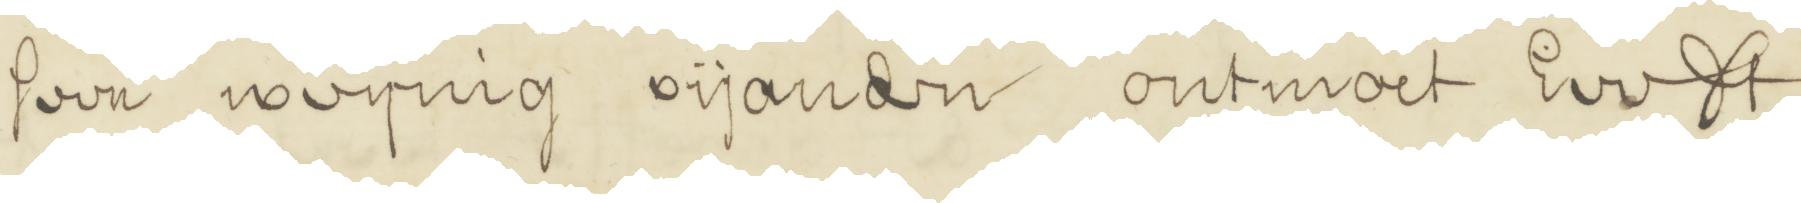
seer weijnig vijanden ontmoet heeft,
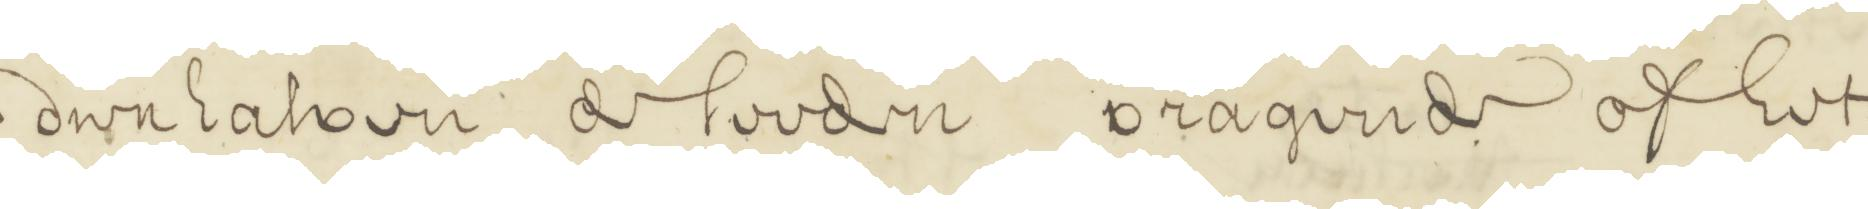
dierhalven de leeden vragende ofhet
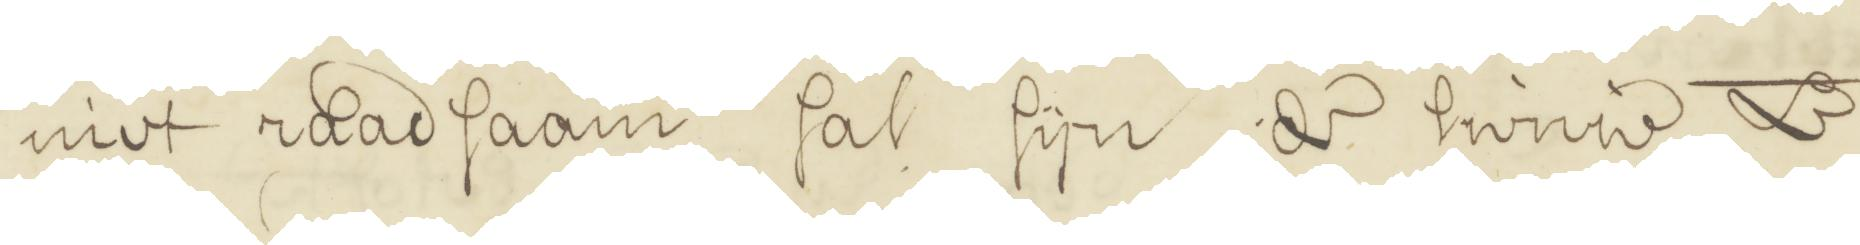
niet raadsaam sal sijn de lienie te
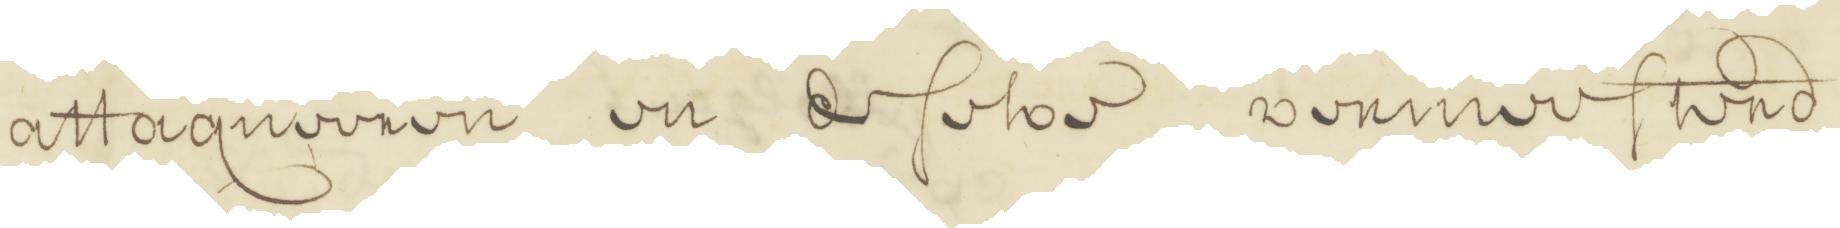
attaqueeren en deselve vermeesterd
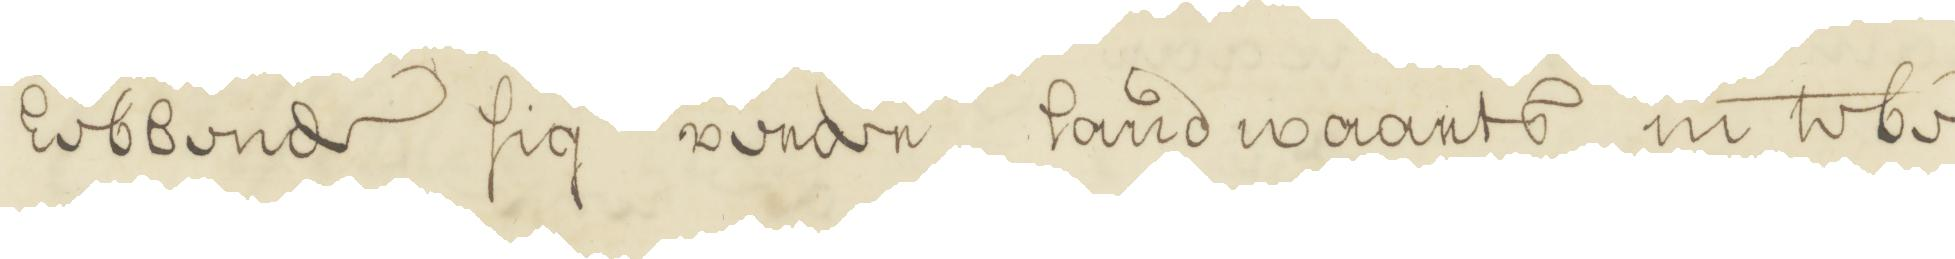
hebbende sig verder landwaarts in tebe,
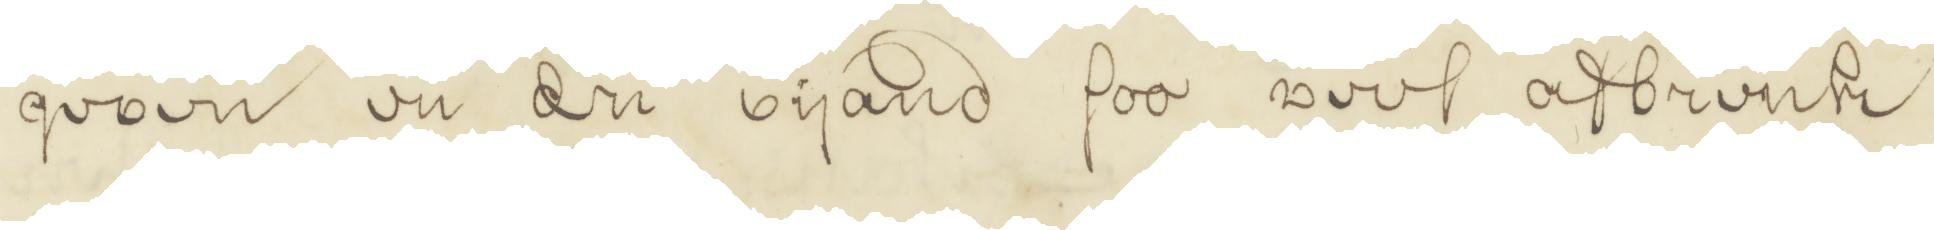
geven en den vijand soo veel afbreuk
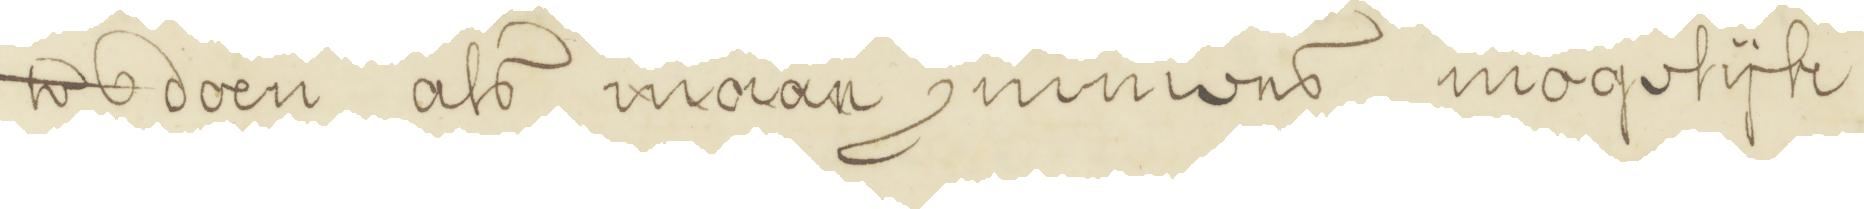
te doen als maar jmmers mogelijk
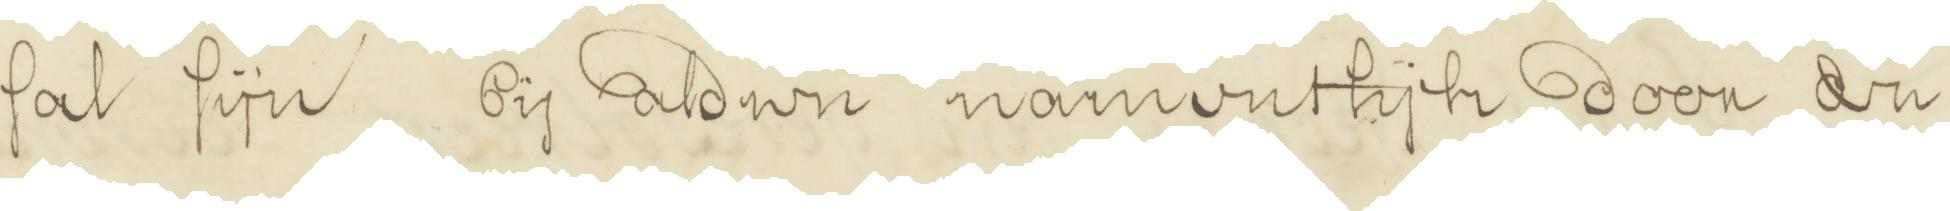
sal sijn bij aldien namentlijk door den
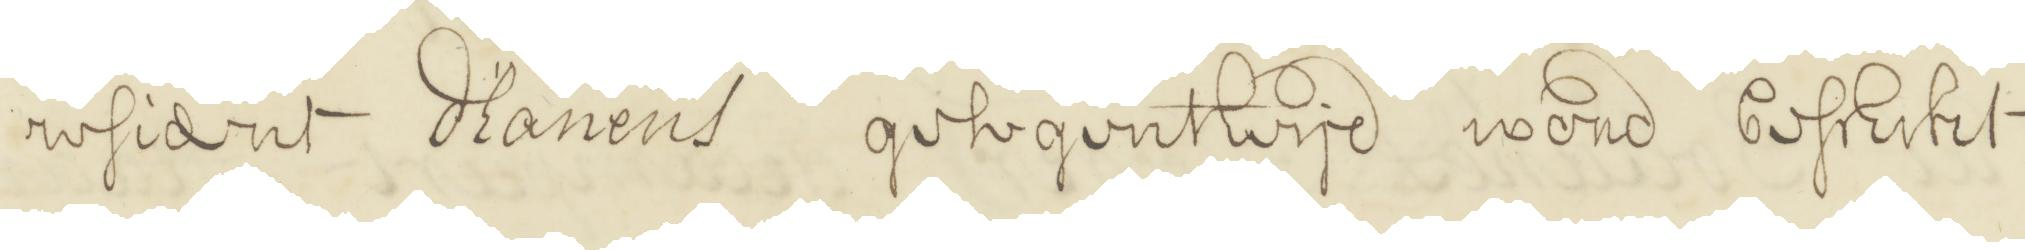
resident d'hanens gelegentheijd word beschikt
